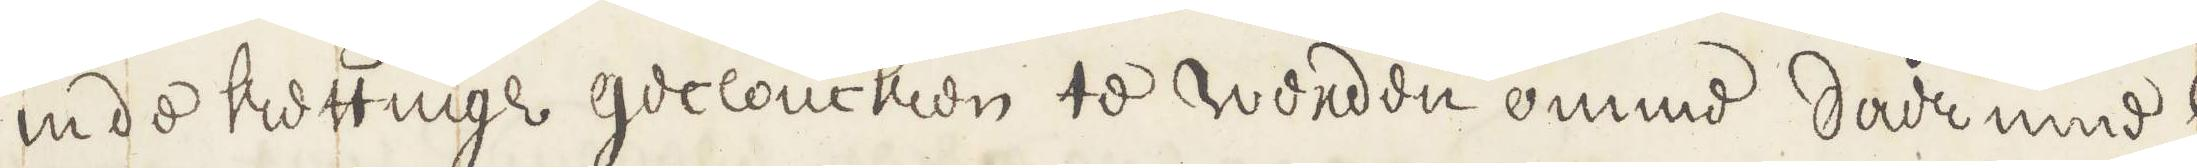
in de kettingh gecloncken te werden omme daer inne
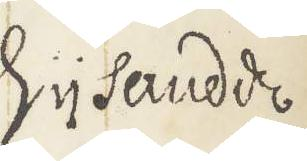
hij sander
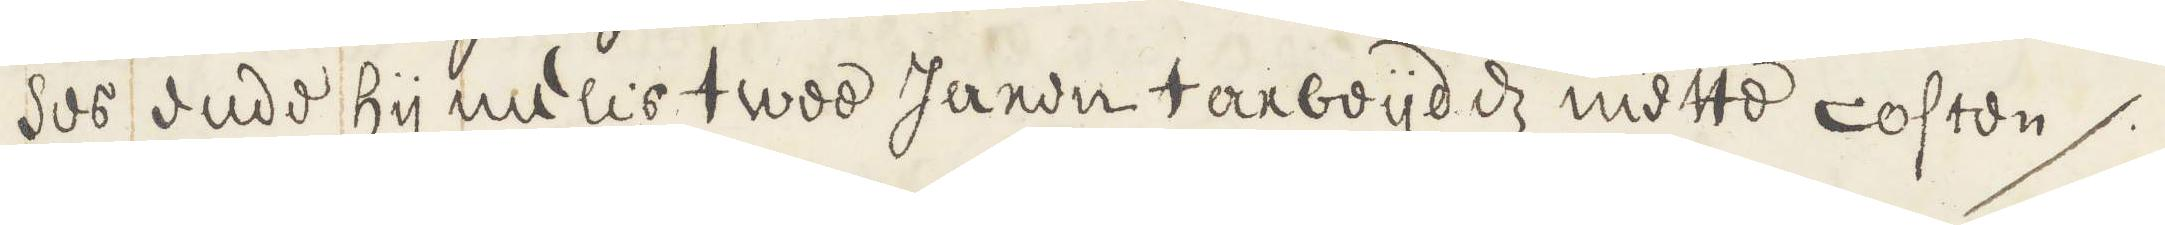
ses ende hij melis twee Jaren t arbeijden mette costen /.
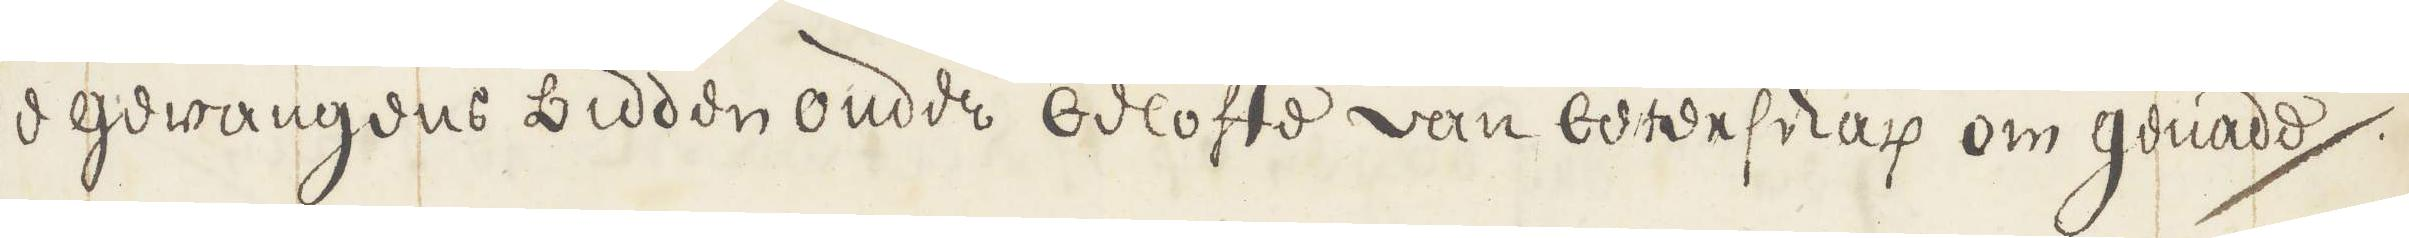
De gevangens bidden onder belofte van beterschap om genade/.
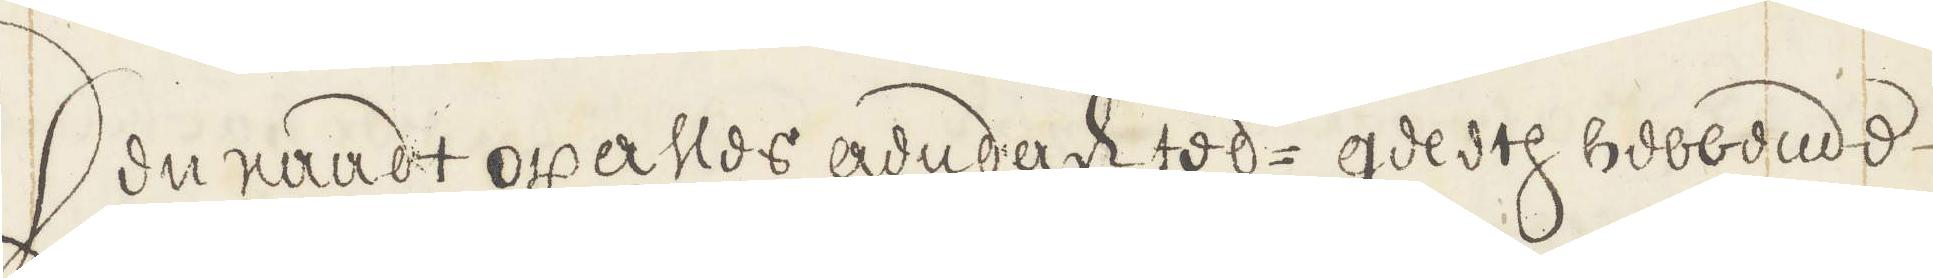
Den raadt op alles aendachtelijk geleth hebbende
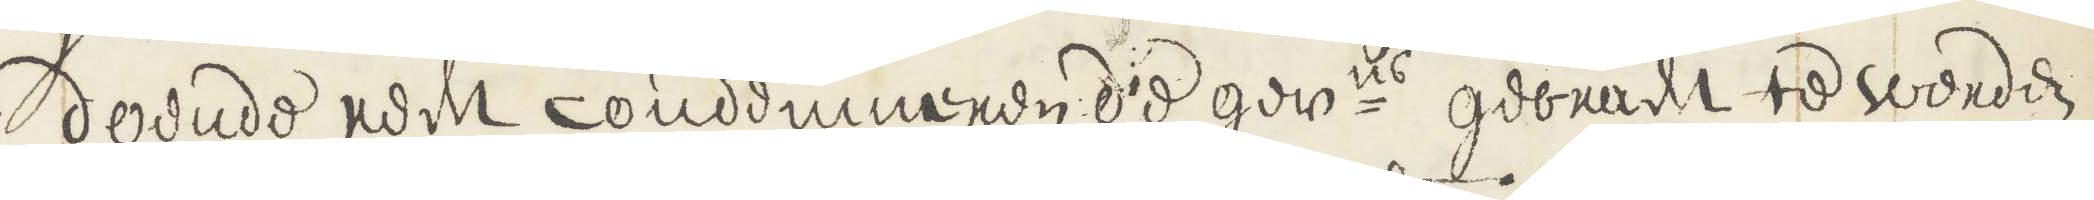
doende recht condemneren: de gev=ns gebracht te werden
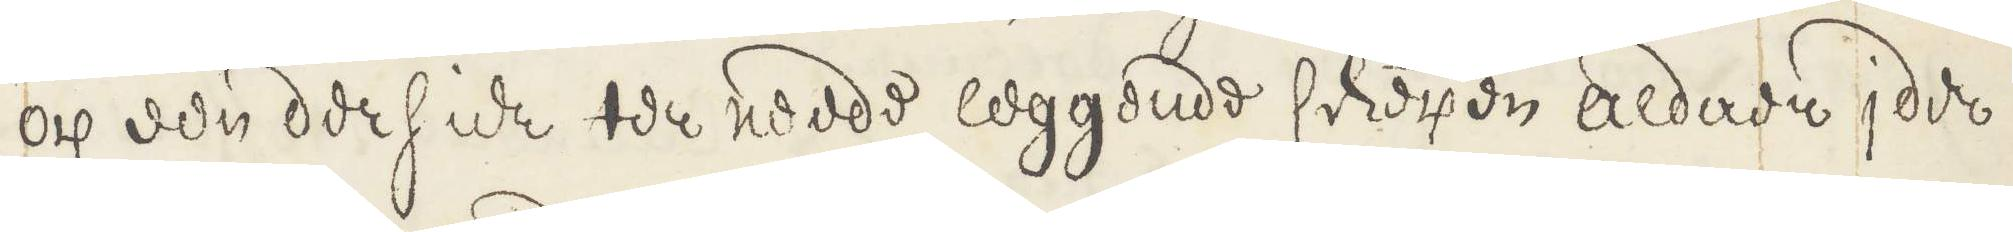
op een derhier ter reede leggende schepen aldaer jder
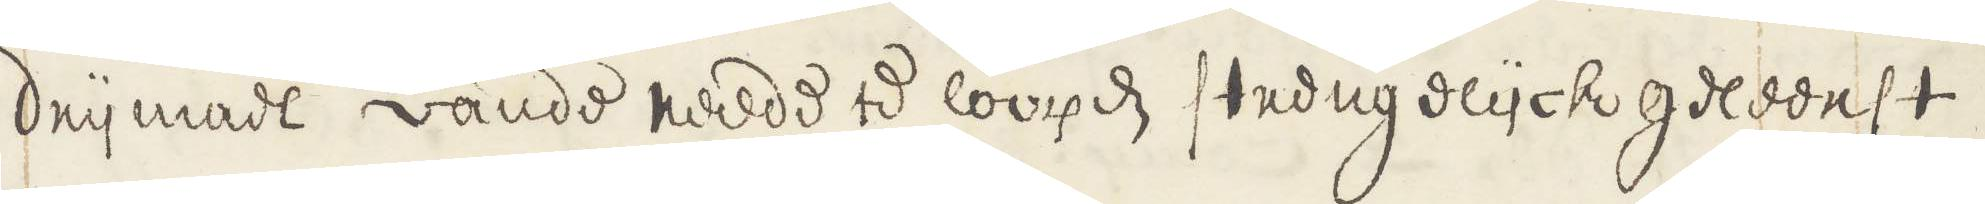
drijmael vande reede te loopen strengelijck geleerst
